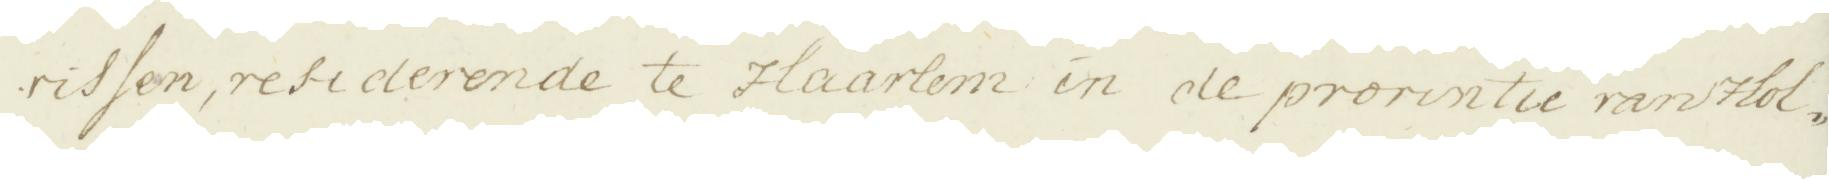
rissen, residerende te Haarlem in de provintie van Hol
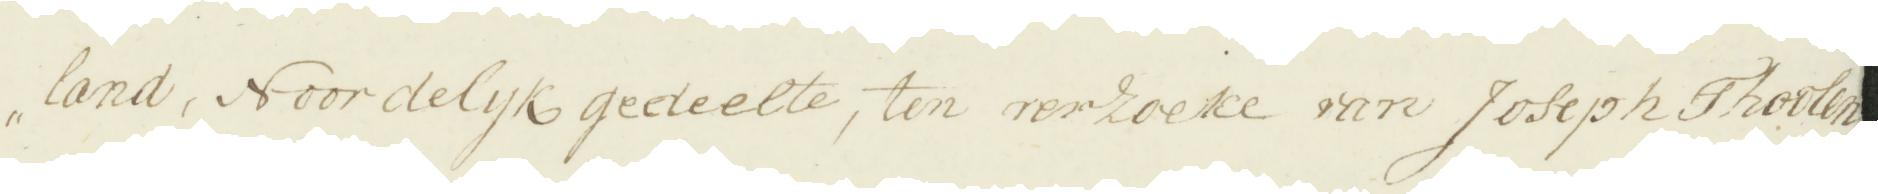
„land, Noordelyk gedeelte, ten verzoeke van Joseph Thoolen,
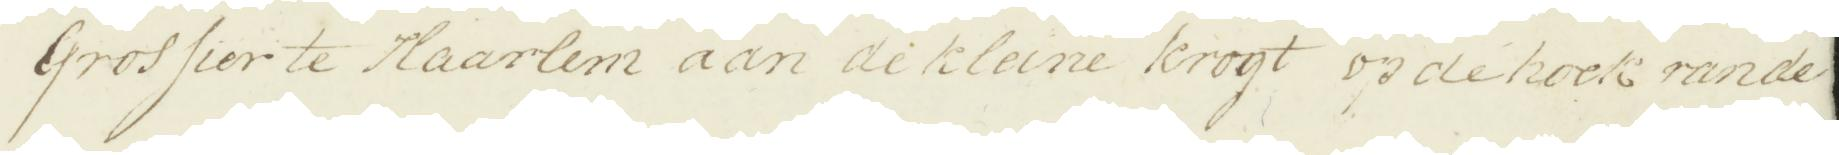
Grossier te Haarlem aan de kleine krogt op de hoek van de
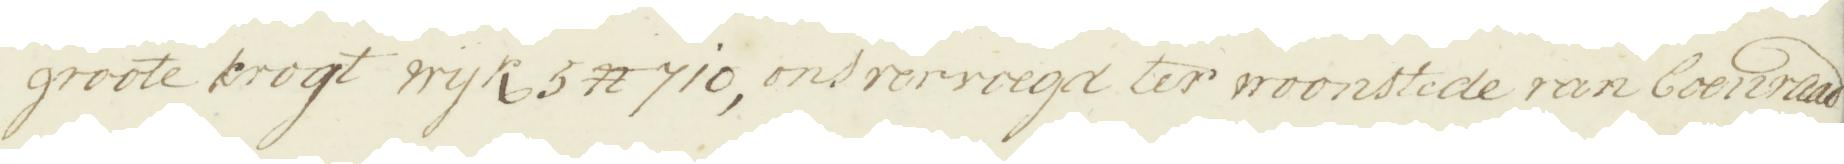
groote krogt wijk 5 n 710, ons vervoegd, ter woonstede van Coenraad
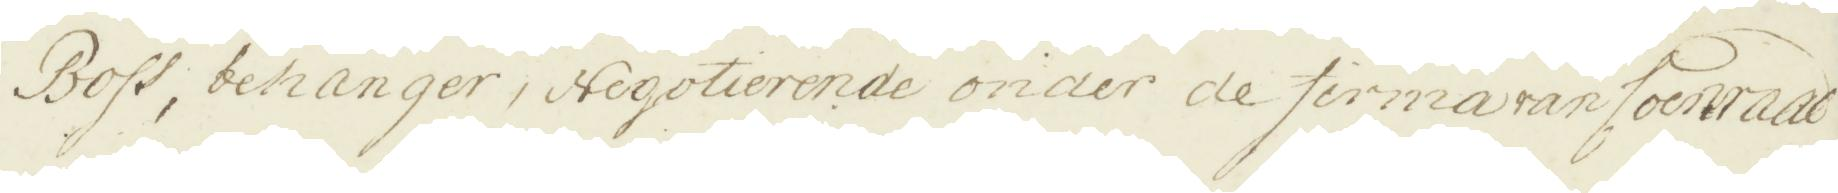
Boss, behanger, Negotierende onder de firma van Coenraad
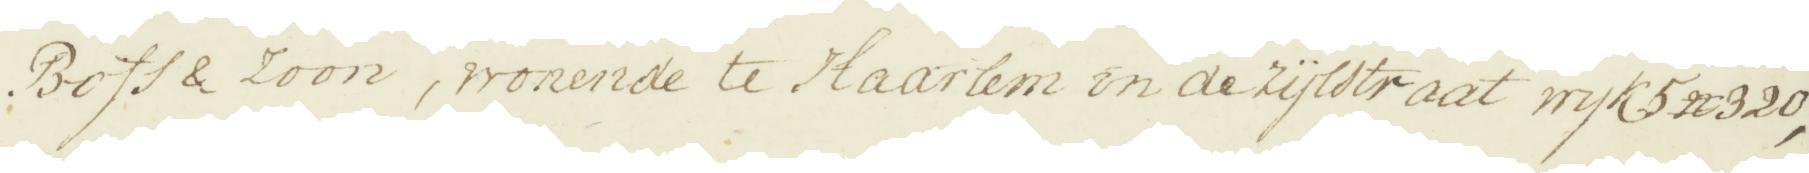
Boss & zoon, wonende te Haarlem in de zijlstraat wyk 5 n 320,
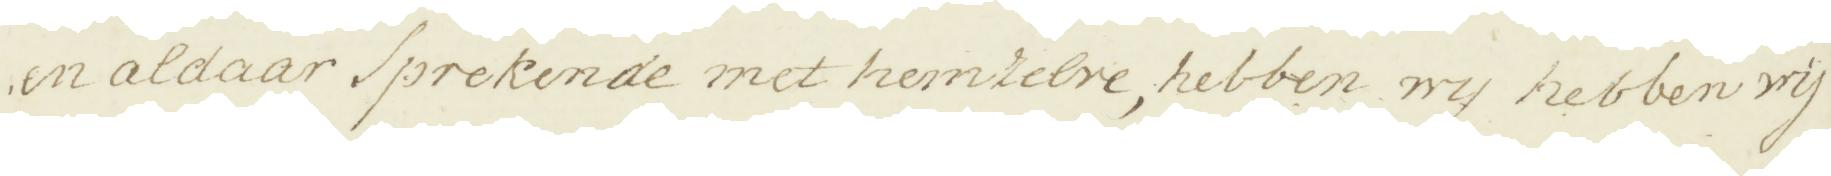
en aldaar sprekende met hemzelve, hebben wy hebben wij
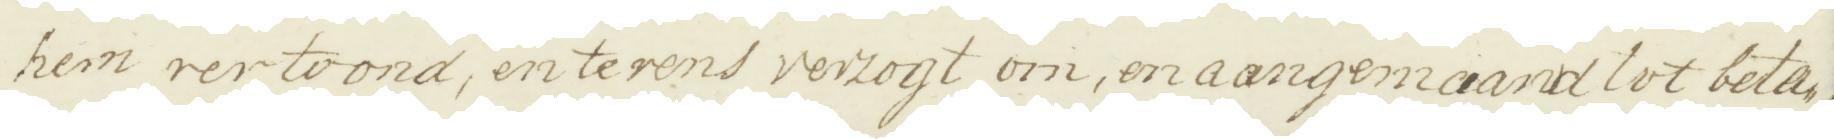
hem vertoond, en tevens verzogt om, en aangemaand tot beta„
